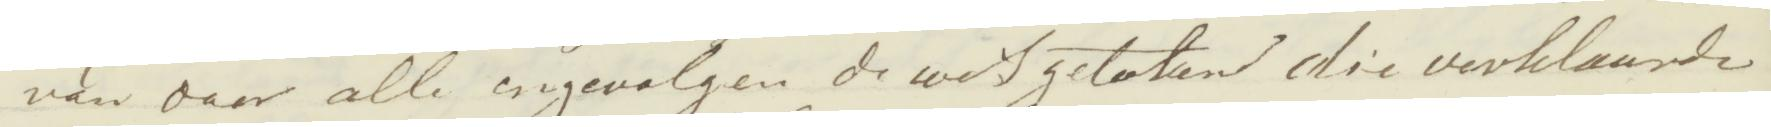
van door alle ingevolgen de wet geteekend die verklaarde
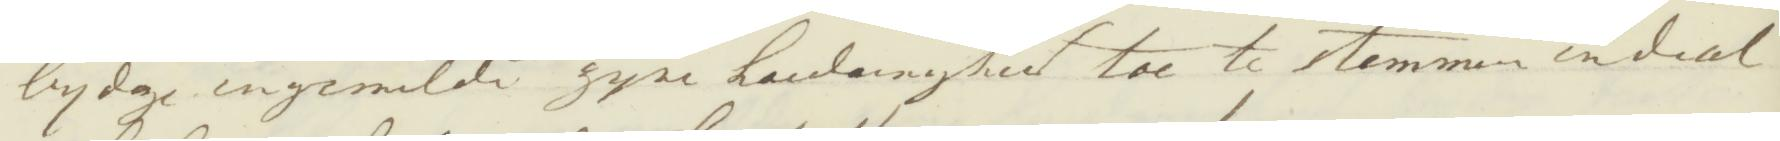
by deze ingemelde zyne hoedanigheid toe te stemmen in de al
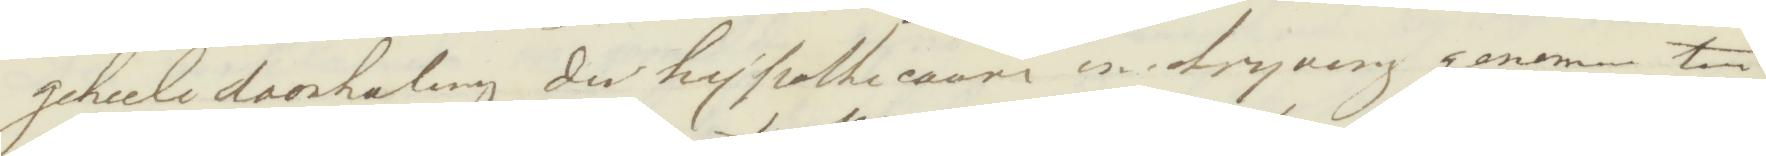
geheele doorhaling der hypothecaire inschryving genomen ten
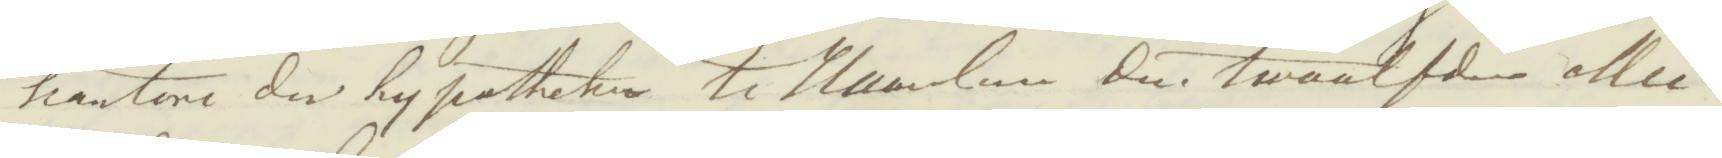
kantore der hypotheken te Haarlem den twaalfden Mei
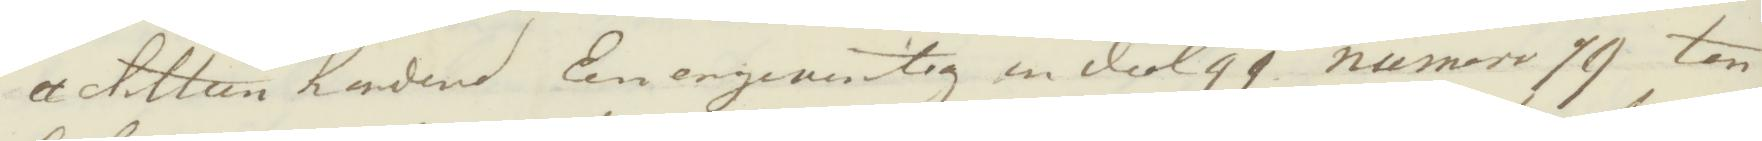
achttien honderd Een en zeventig in deel 99. numero 79 ten
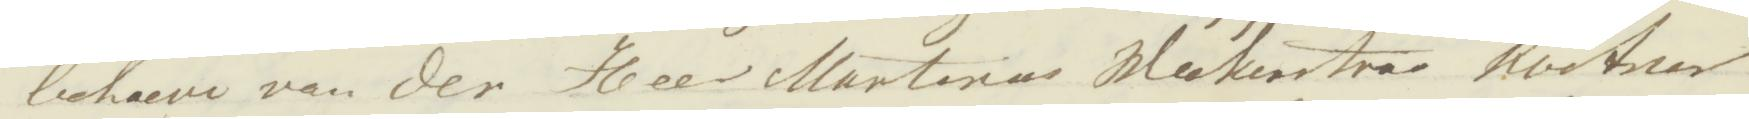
behoeve van den Heer Martinus Meekerstra Koetsier
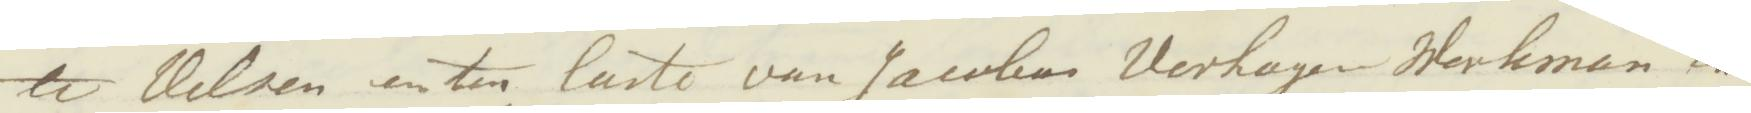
te Velsen en ten laste van Jacobus Verhagen Werkman en
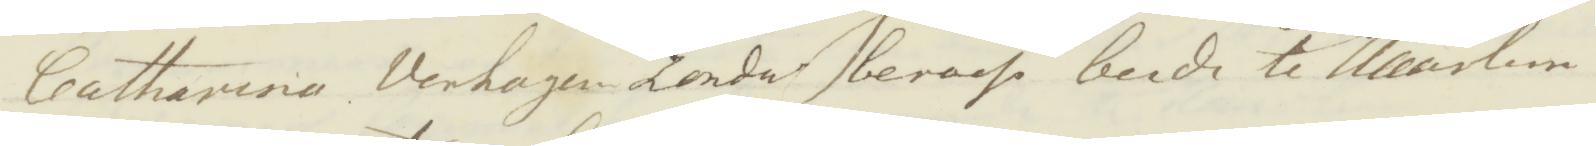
Catharina Verhagen zonder beroep beide te Haarlem
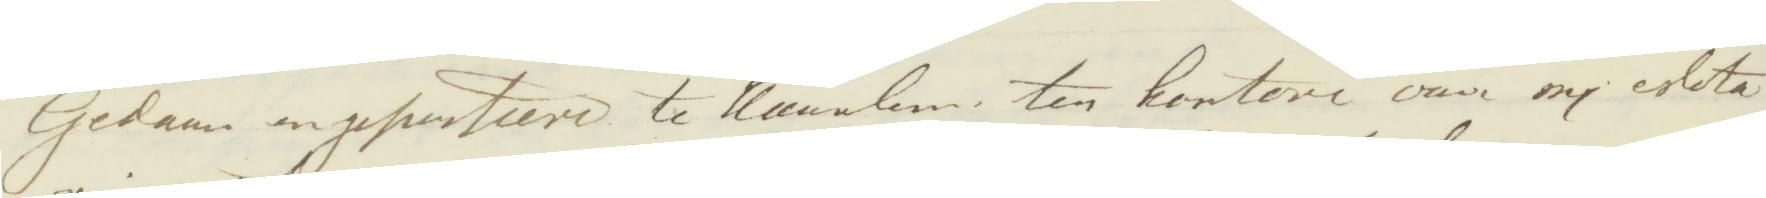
Gedaan en gepasseerd te Haarlem, ten kontore van mij Nota
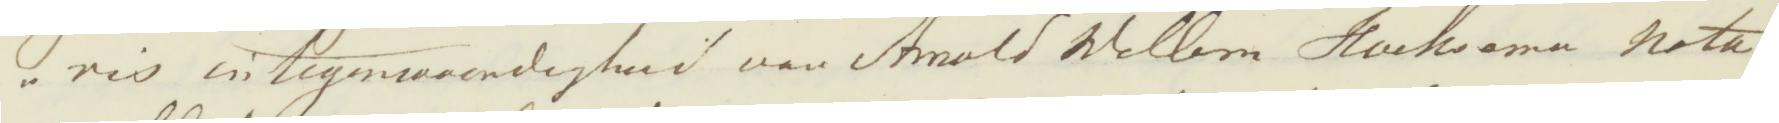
„ ris in tegenwoordigheid van Arnold Willem Hoeksema Nota
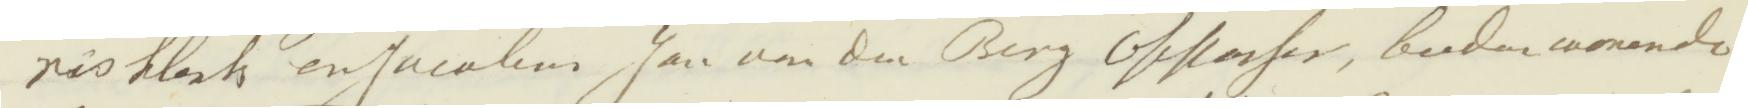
ris klerk en Jacobus Jan van den Berg Oppasser, beiden wonende
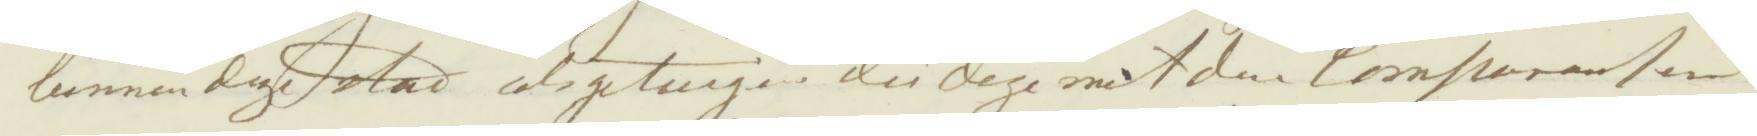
binnen deze stad als getuigen die deze met den Comparanten
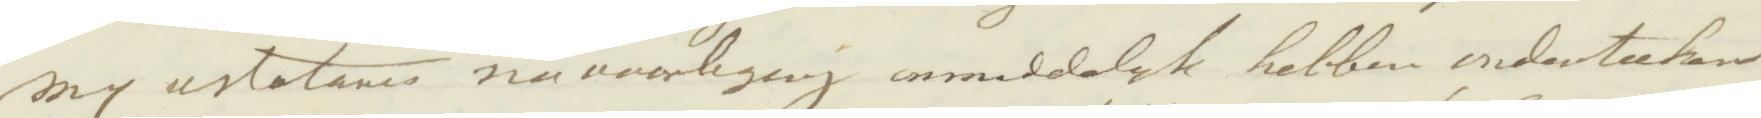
my notaris na voorlezing onmiddelyk hebben onderteekend
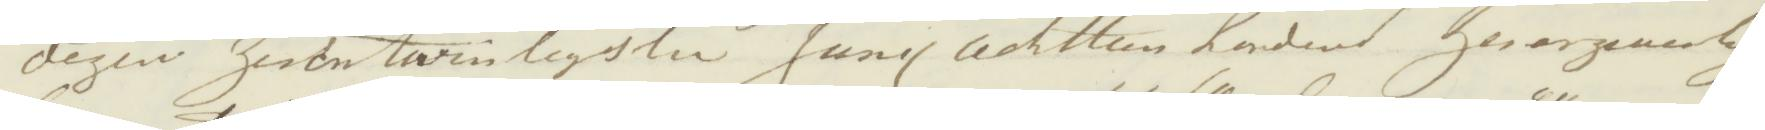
dezen Zesentwintigsten Juny achttien honderd Zesenzeventig
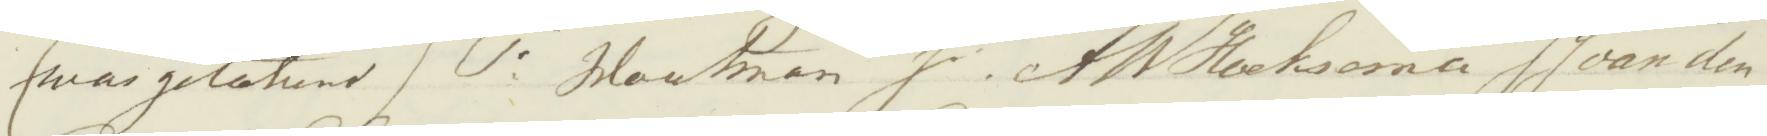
(was geteekend ) F. Woutman J:r A W Hoeksema J J van den
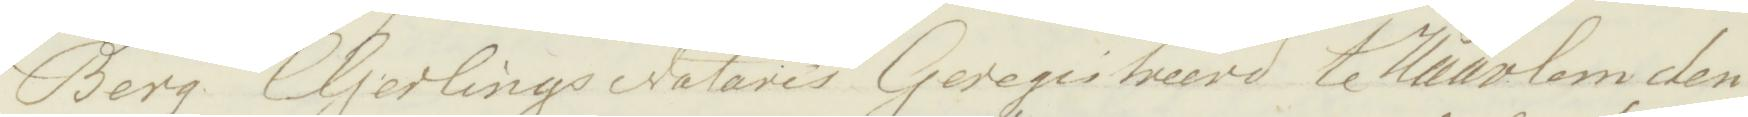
Berg. C Gerlings Notaris Geregistreerd te Haarlem den
